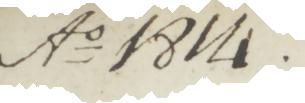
A=o 1814.
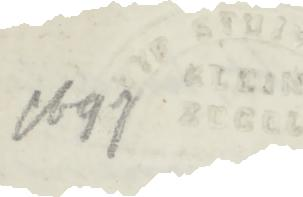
1697
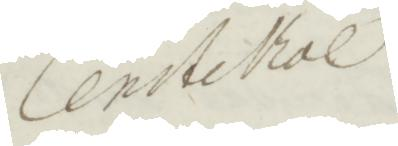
EersteRol
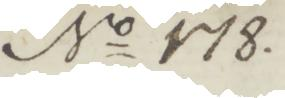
N=o 118.
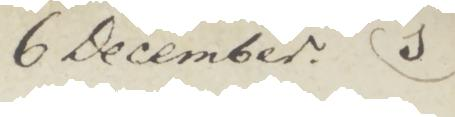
6 December. 1
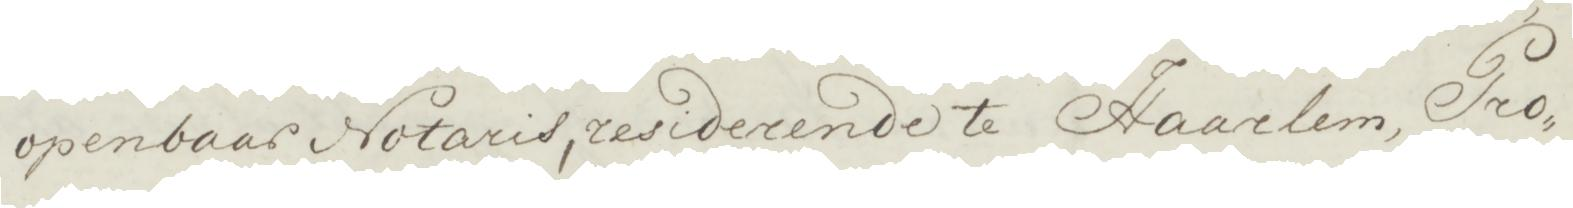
openbaar Notaris, residerende te Haarlem, Pro„
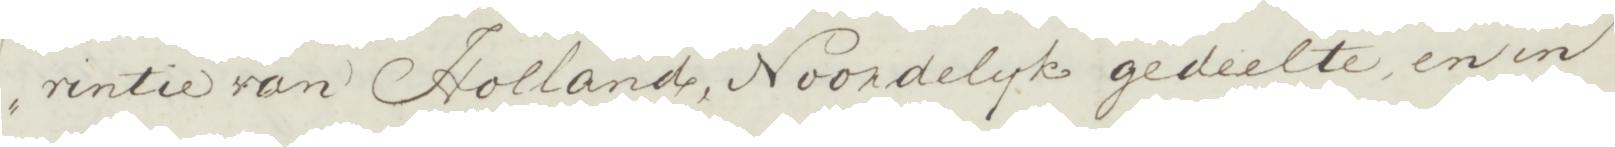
„vintie van Holland, Noordelyk gedeelte, en in
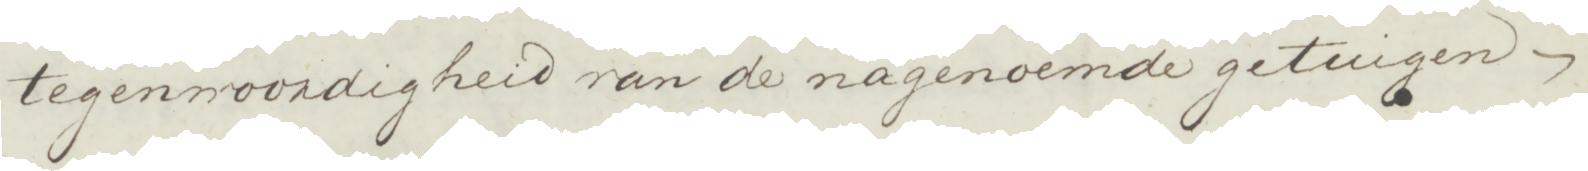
tegenwoordigheid van de nagenoemde getuigen-
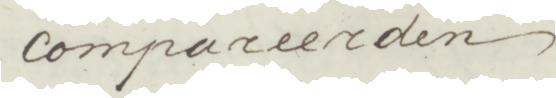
compareerden
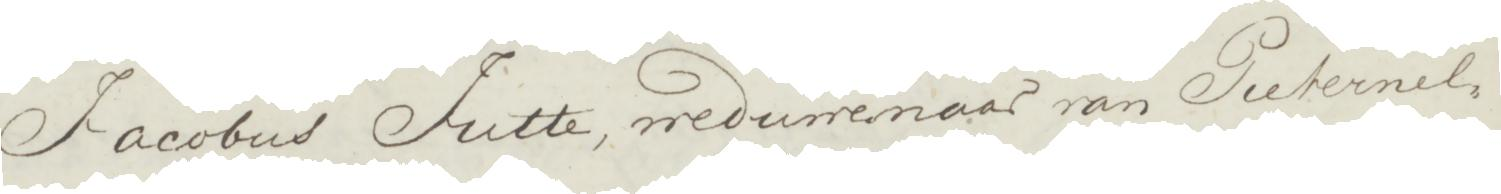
Iacobus Iutte, weduwenaar van Pieternel„
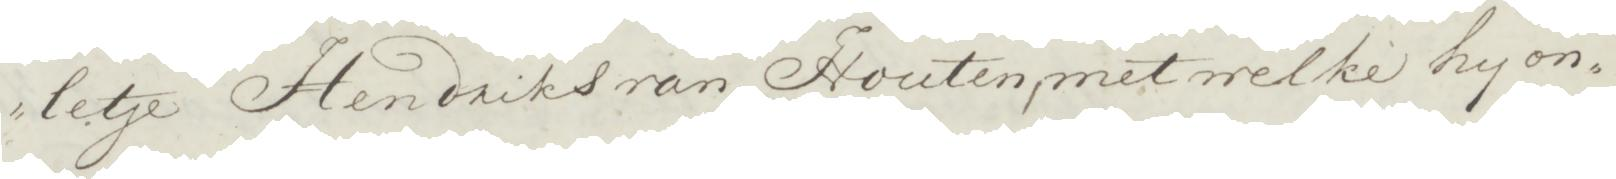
„letje Hendriks van Houten, met welke hy on„
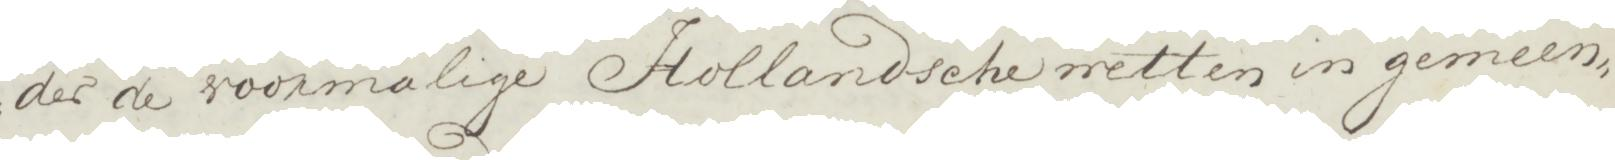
„der de voormalige Hollandsche wetten in gemeen,
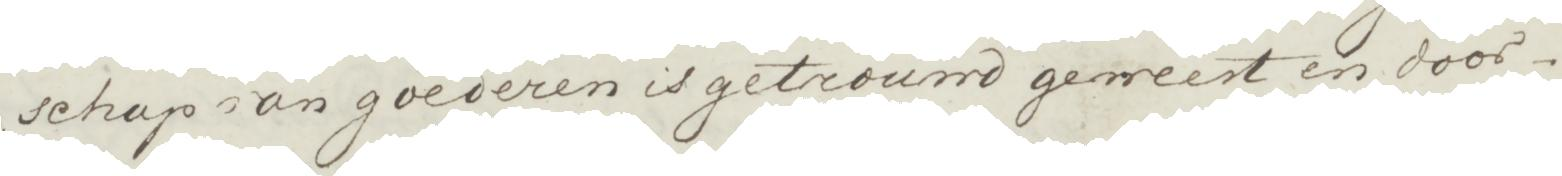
„schap van goederen is getrouwd geweest en door-
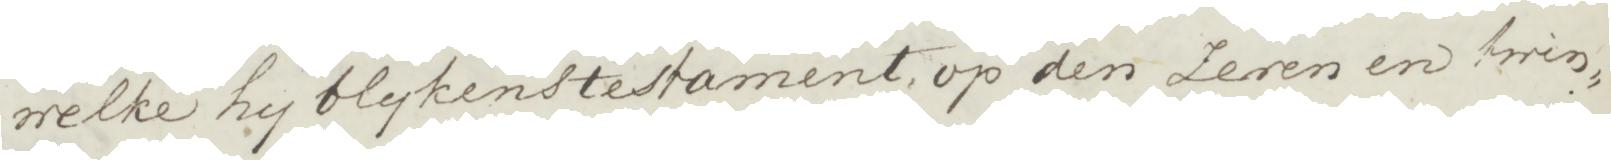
welke hy blykens testament, op den zeven en twin„
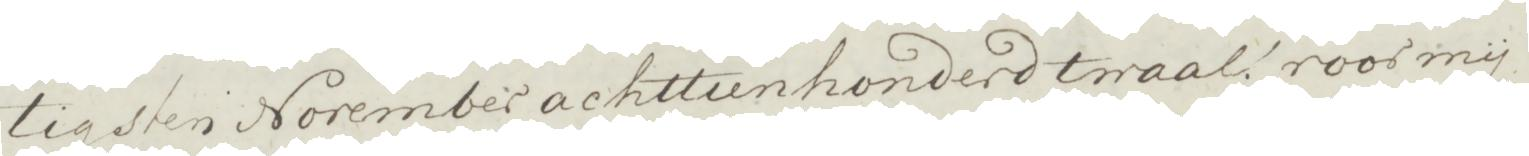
tigsten November achttienhonderd twaalf voor mij
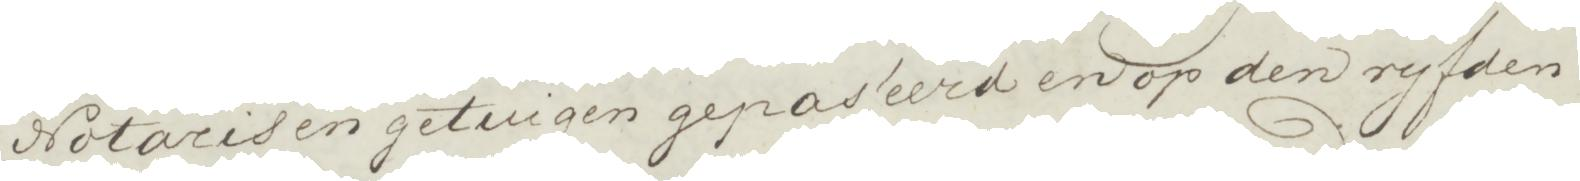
Notaris en getuigen gepasseerd en op den vyfden
